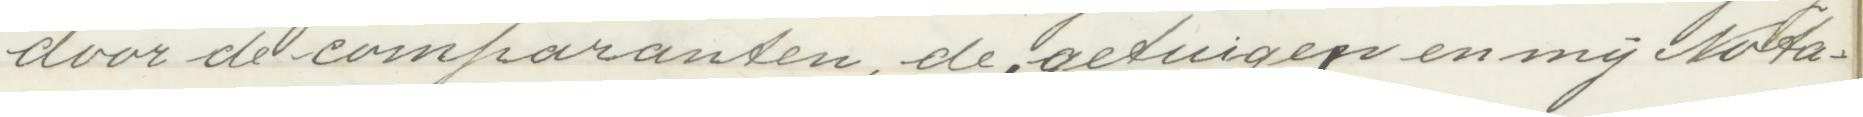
door de comparanten, de getuigen en mij Nota-
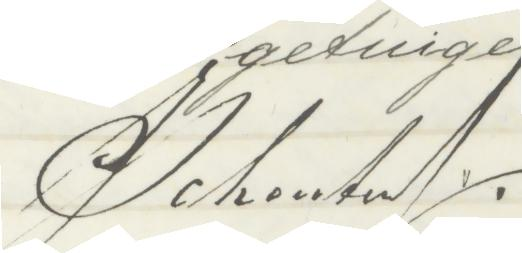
JSchoutens
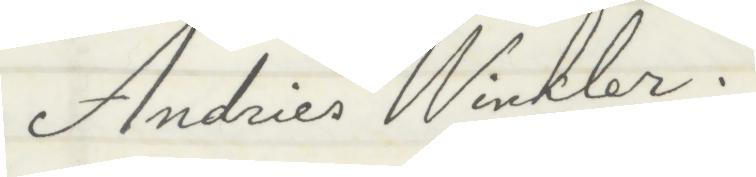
Andries Winkler.
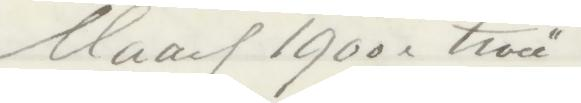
Maart 1900 en twéé
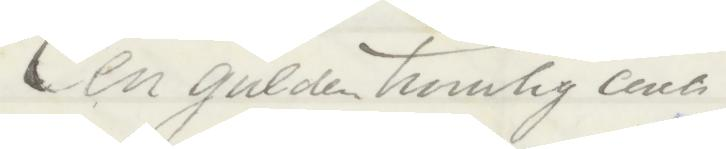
Een gulden twintig cents
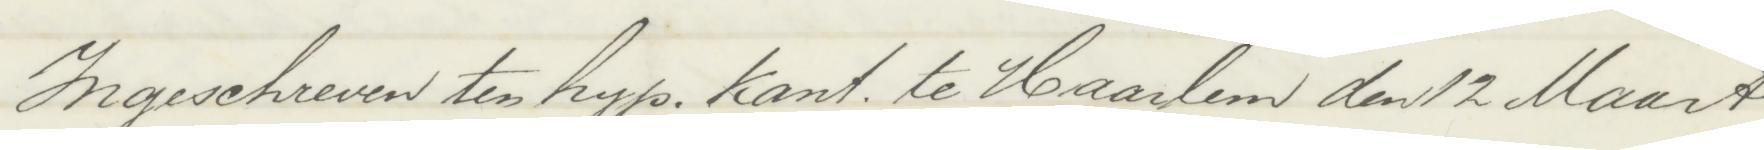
Ingeschreven ten hyp, kant. te Haarlem den 12 Maart
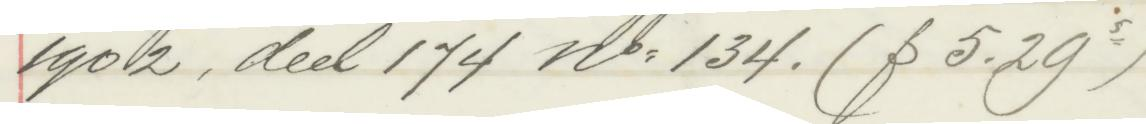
1902, deel 174 N=o 134. ( ƒ 5.29=5 )
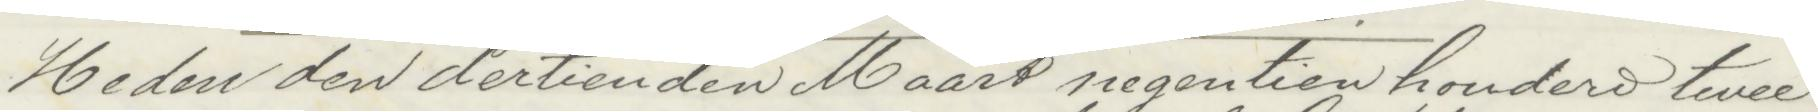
Heden den dertienden Maart negentien honderd twee
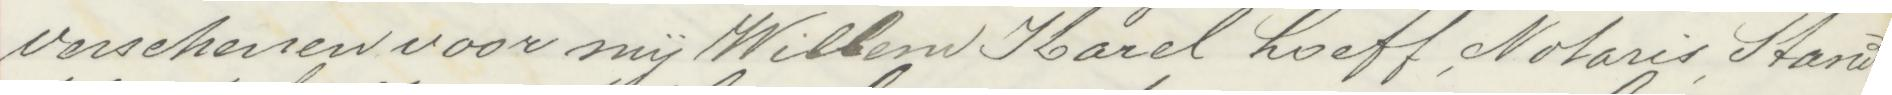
verschenen voor mij Willem Karel Loeff, Notaris, stand,
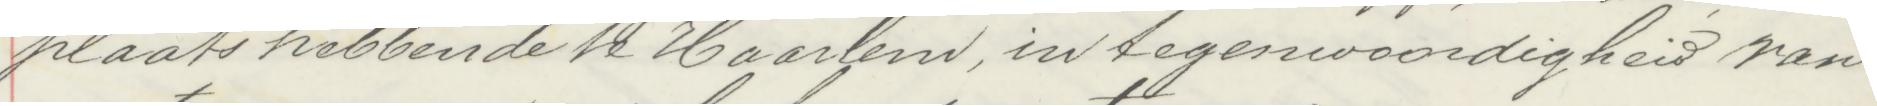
plaats hebbende te Haarlem, in tegenwoordigheid van
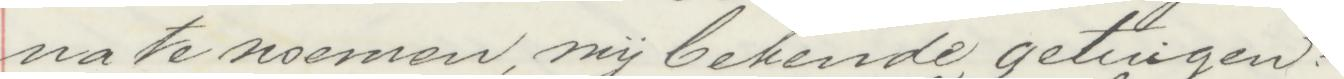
na te noemen, mij bekende getuigen:
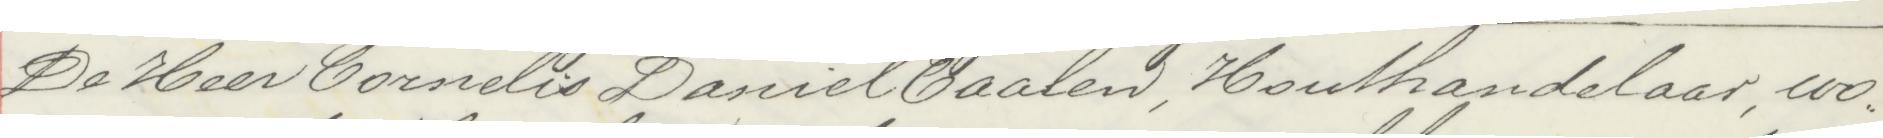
De Heer Cornelis Daniel Caalen, Houthandelaar, wo„
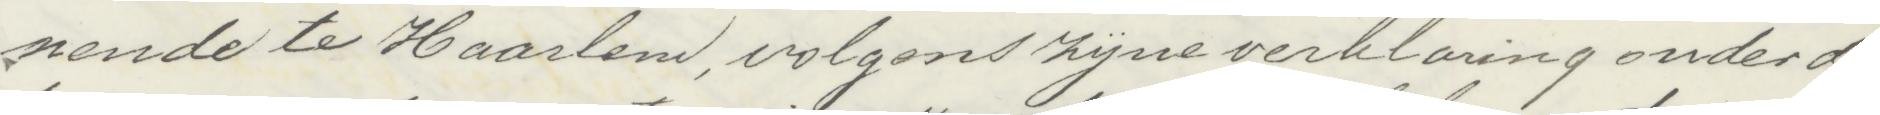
nende te Haarlem, volgens zijne verklaring onder de
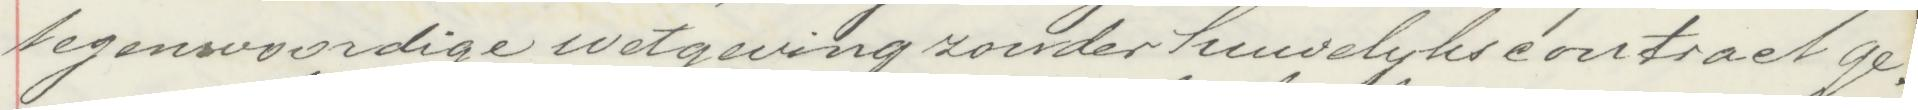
tegenwoordige wetgeving zonder huwelykscontract ge„
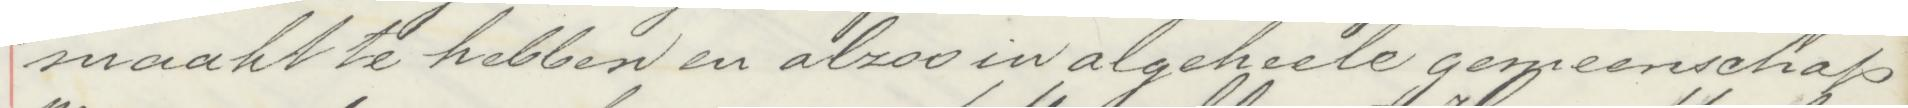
maakt te hebben en alzoo in algeheele gemeenschap
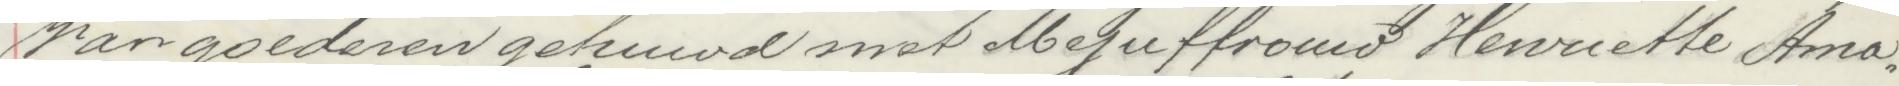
van goederen gehuwd met Mejuffrouw Henriette Ama„
